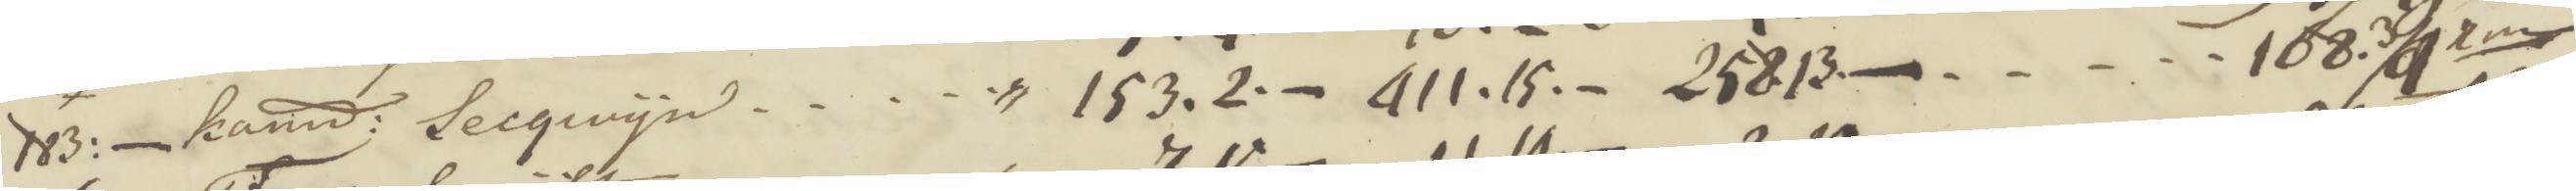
183: — kann: secqwijn - - - - - „ 153. 2.– 411.15.– 258.13.— - - – - - 168.¾ r–m
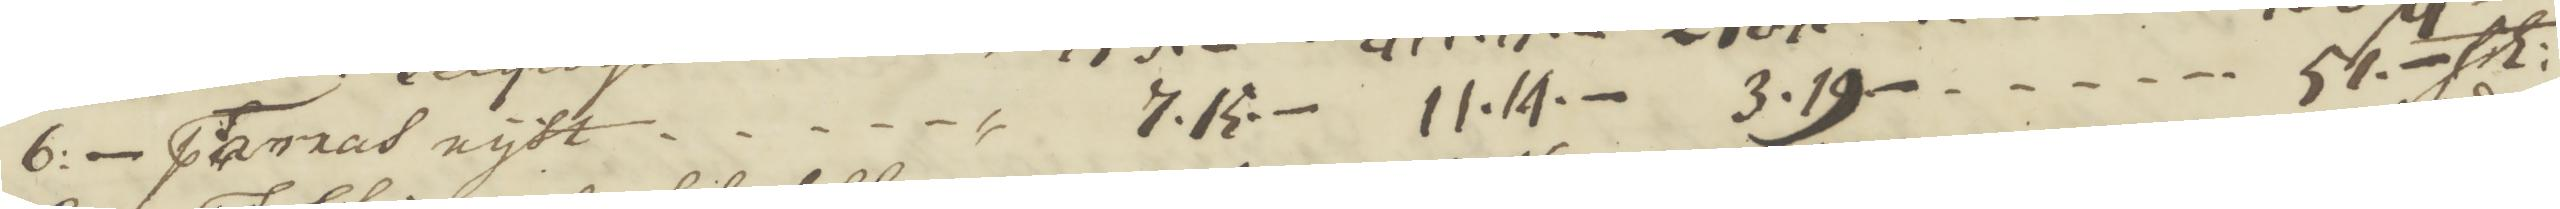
6: — ps arras rijst - - - - – „ 7.15. – 11.14. – 3.19.– - - - - - - 51. – sch:
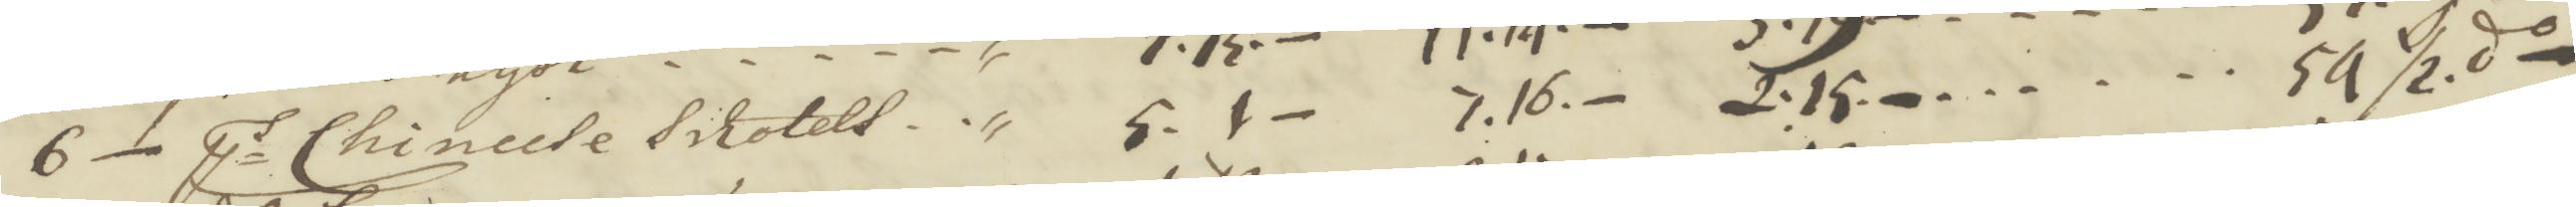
6 — p=s Chineese schotels - . „ 5. 1 – 7.16. – 2.15. - - - - - . 54½. d–o
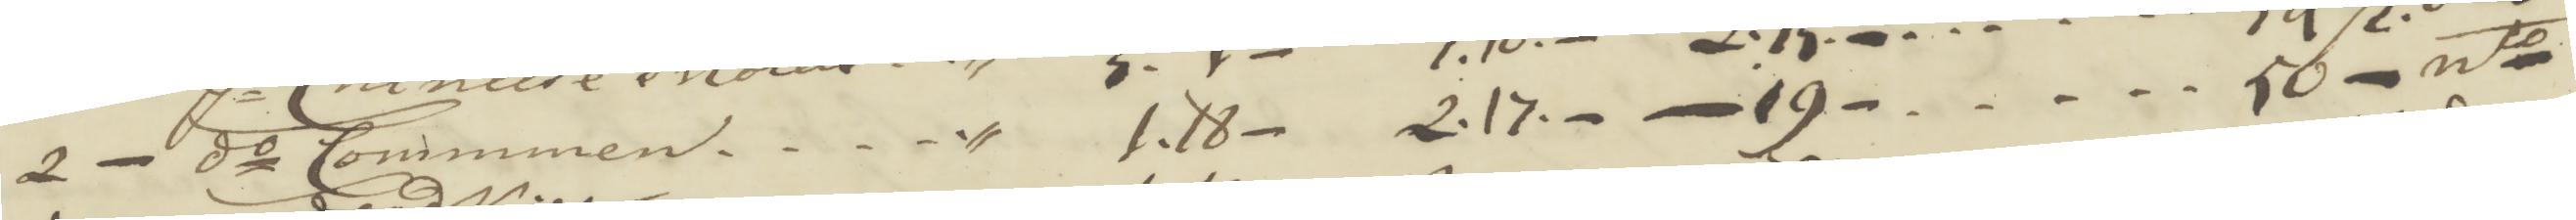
2 — d=o Conimmen - - - - . „ 1.18 – 2.17. – — 19 – - - - - - 50 — n–to
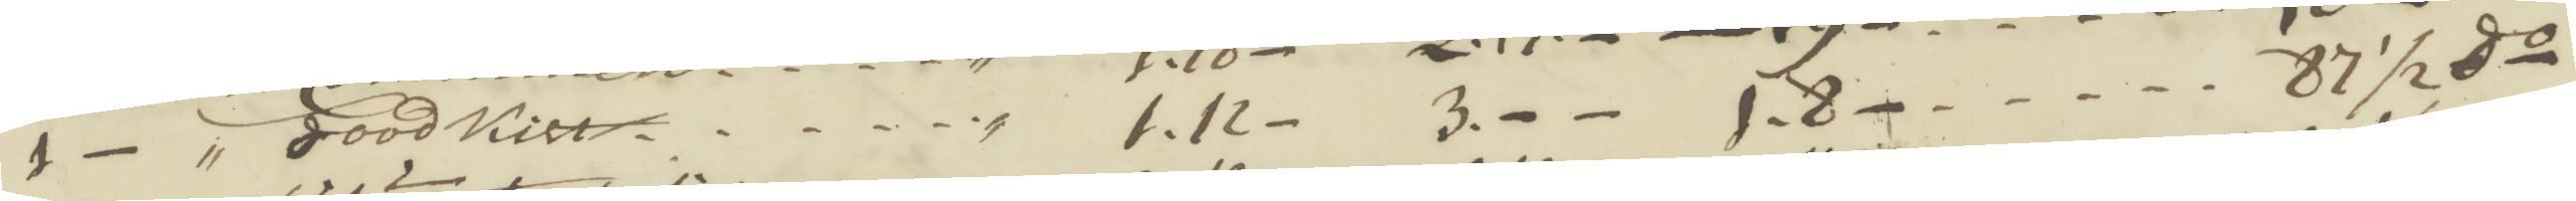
1 — „ dood kist - - - - - . „ 1.12– 3.– – 1.8 – - - - - - 87½ d–o
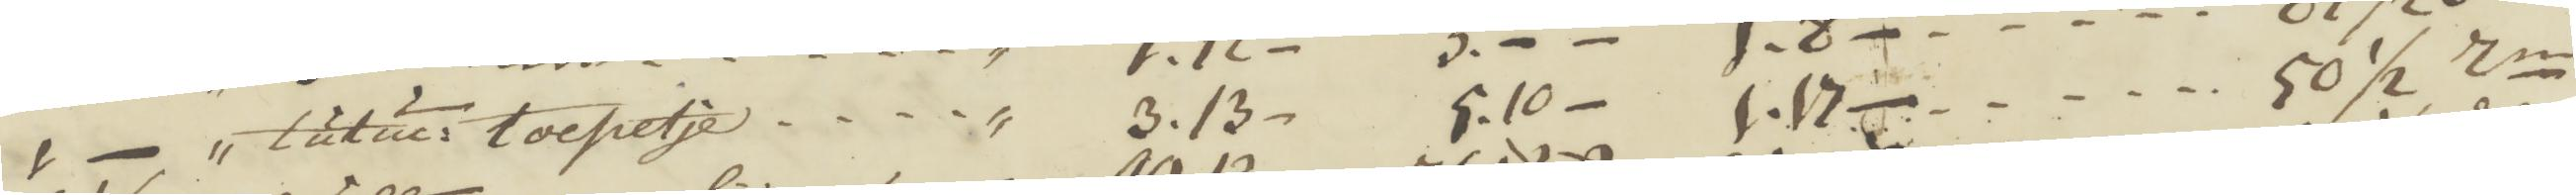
1 — „ tutuc: toepetje - - - - „ 3.13– 5.10 – 1.17— - - - - - . 50½ r–m
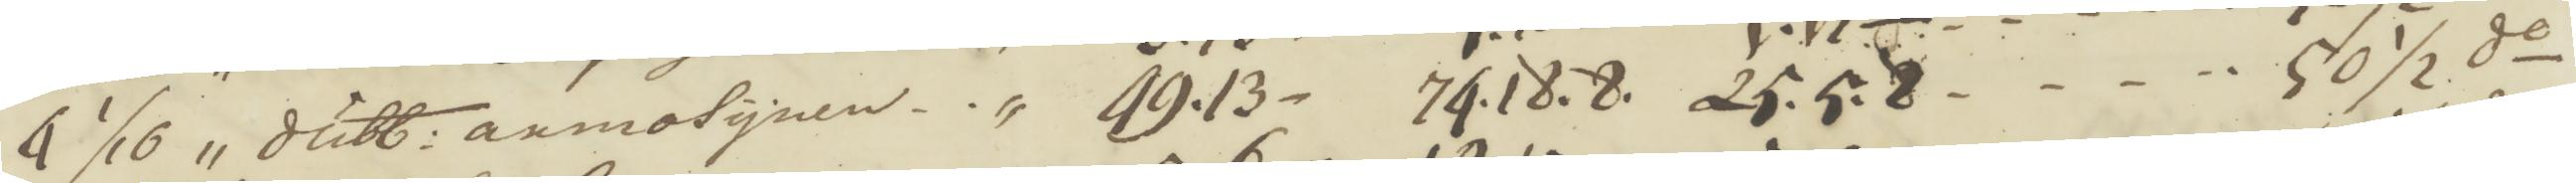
4 1/16 „ dubb: armosijnen - . „ 49.13– 74.18.8. 25.5.8 - - - - . 50½ d–o
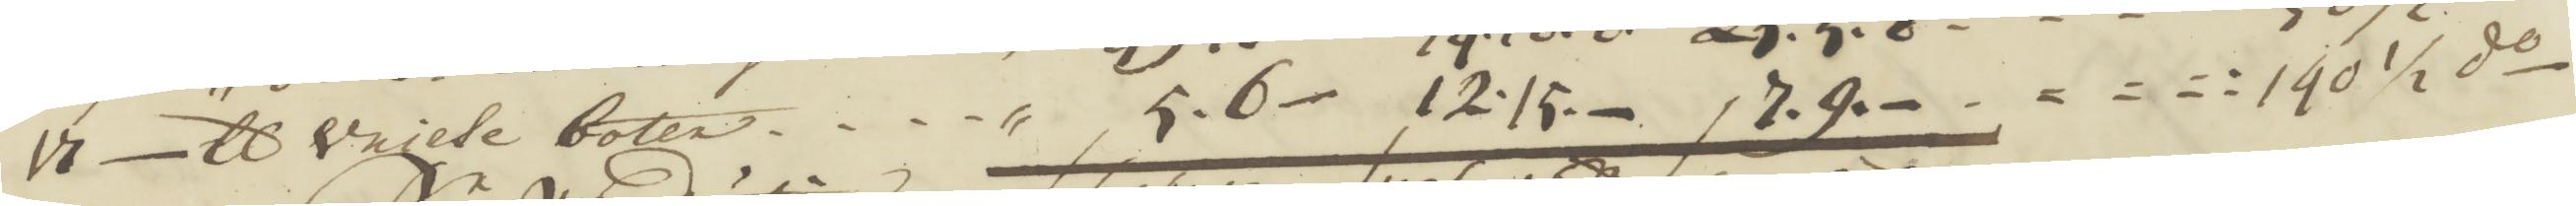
17 — lb vriese boter - - - - „ 5.6— 12.15.– 7.9.– - - - - - 140½ d–o
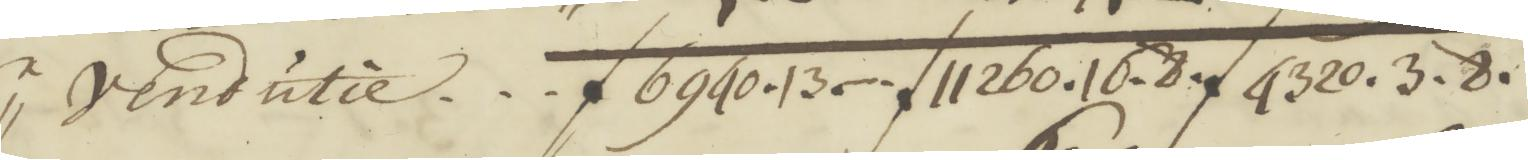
r vendutie - - - ƒ 6940.13.– - ƒ11260.16.8. ƒ 4320. 3. 8.
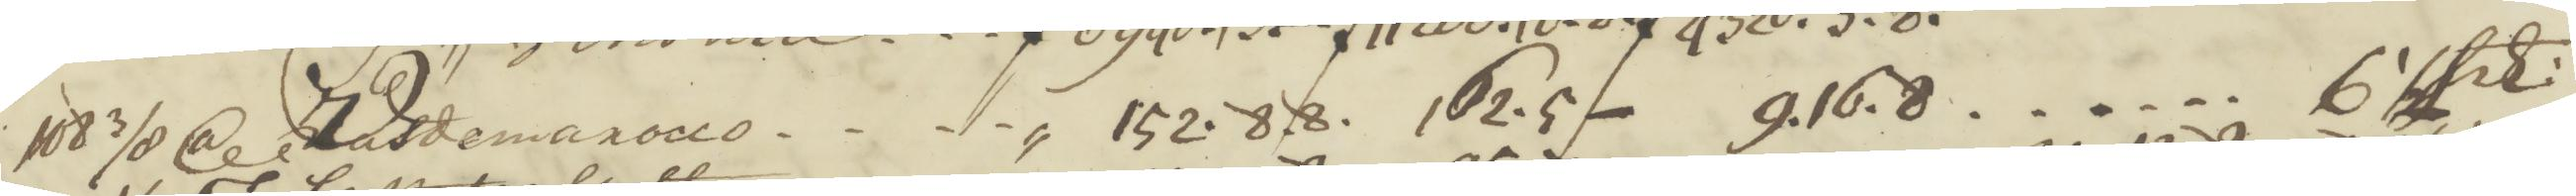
108 3/8 @ rasdemarocco - - - - „ 152. 8.8. 162. 5 – 9.16.8 - - - - - - 6½ sch:
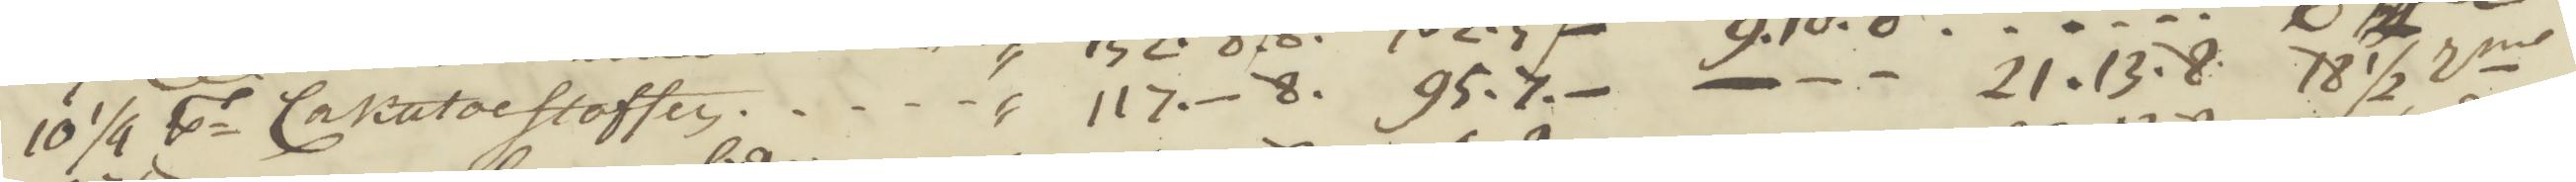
10¼ p=s Cakatoestoffen . - - - - „ 117.— 8. 95. 7.– – – – 21. 13. 8: 18½ r–m
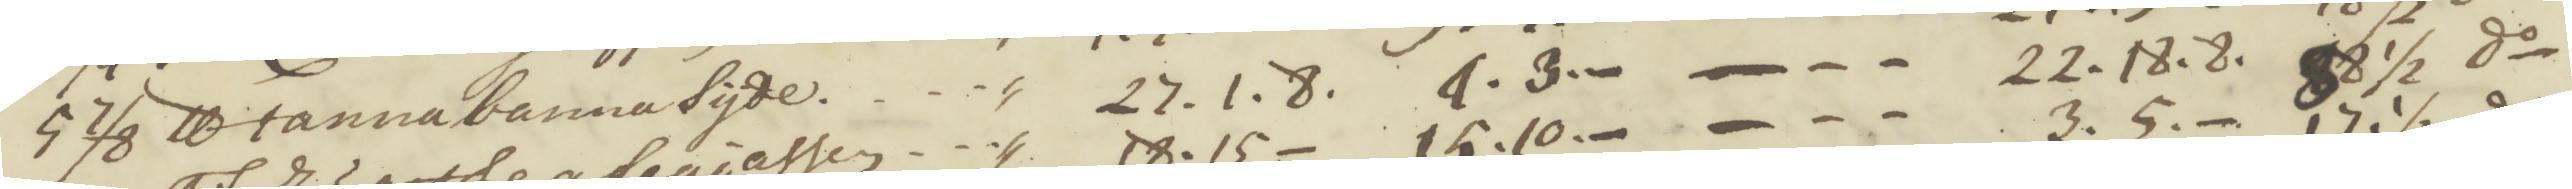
5 7/8 lb tannabanna sijde. - - - „ 27. 1. 8. 4. 3.– – – – 22.18.8. 88½ d–o
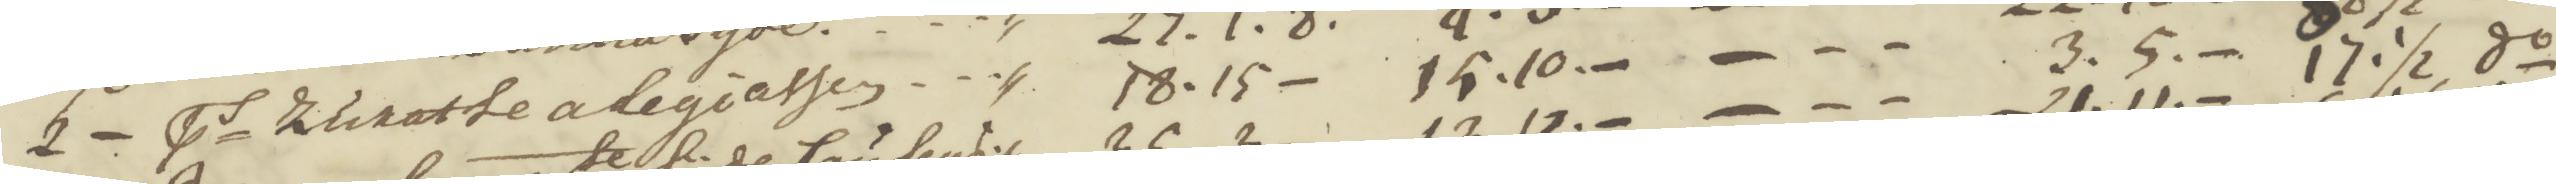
2 – p=s zuratse alegiassen - - - „ 18. 15 – 15.10.– — – – 3. 5.– 17.½ d–
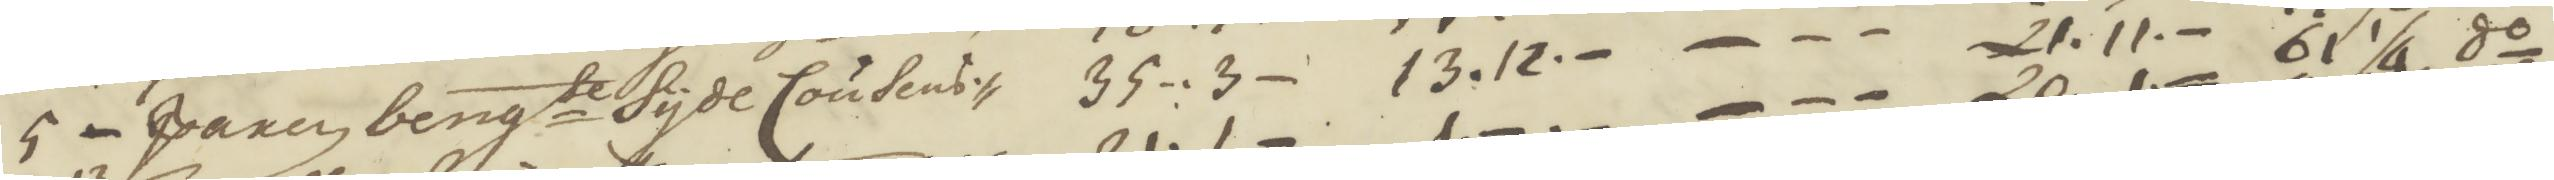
5 – paren beng=se sijde Cousens.„ 35-. 3– 13.12.– — – – 21. 11.– 61¼ d–o
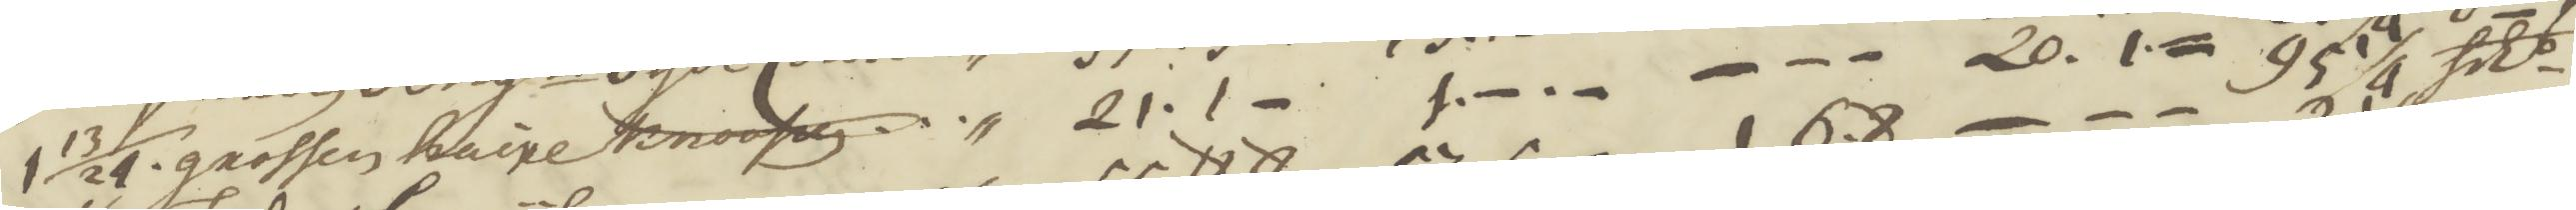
1 13/24. grossen haire knoopen - . . „ 21. 1 – 1. – . – — – – 20. 1. = 95¼ sch–s
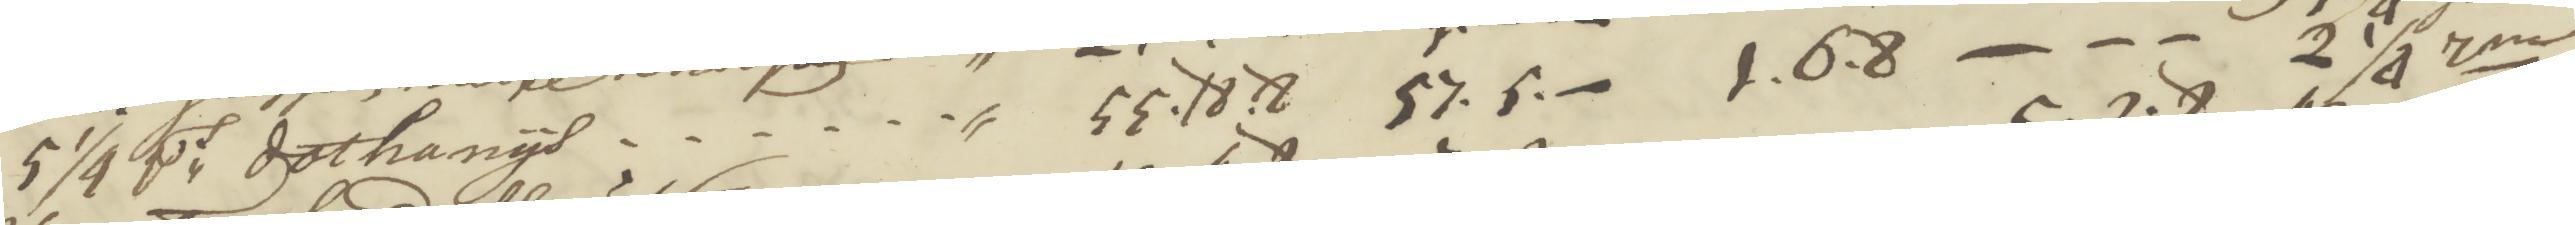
5¼ p„s dothanijs - - - - - - „ 55.18.8 57. 5.– 1.6.8 — – – 2¼ r–m
